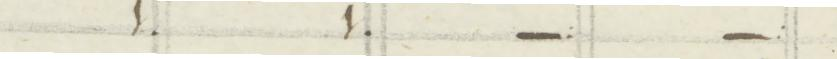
1. 1. —: —:
